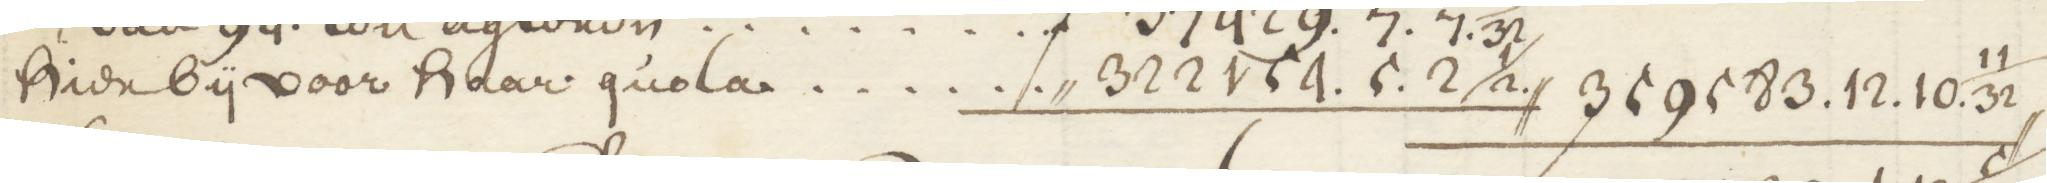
hier bij voor haar quota . . . . . . „ 322154.5.2½. „ 359583.12.10 11/32
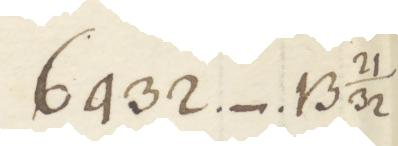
6432.-.13 21/32
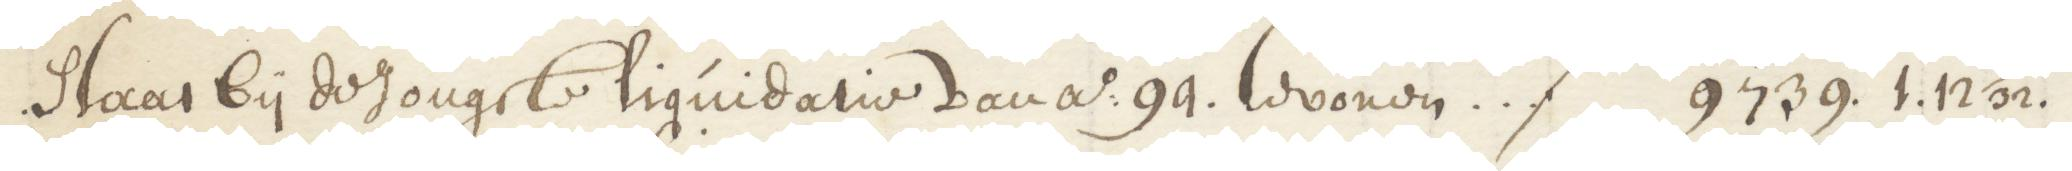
Staat bij de jongste liquidatie van a:o 94. tevoren . . ƒ 9739.1.12 5/32.
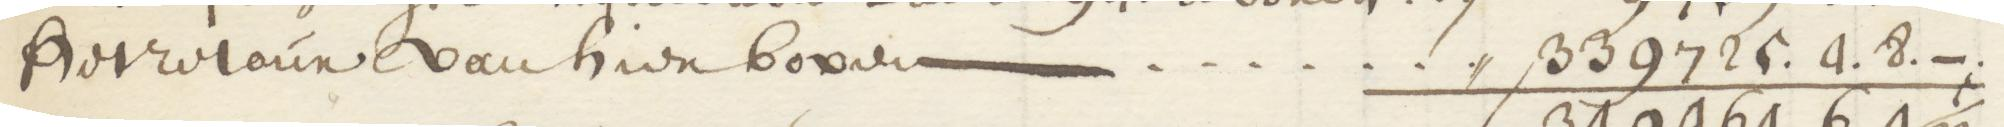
Het retour van hier boven . . . . . . „ 339725.4.8.-.
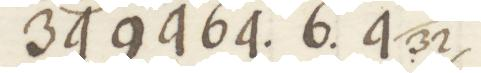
349464.6. 4 5/32
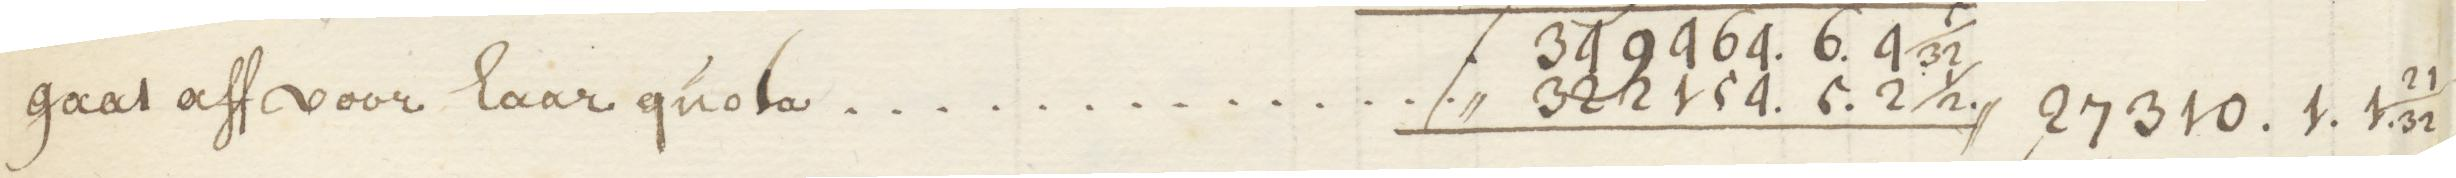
gaat aff voor haar quota . . . . . . . . . . . . . „ 322154.5.2½.„ 27310.1.1.21/32
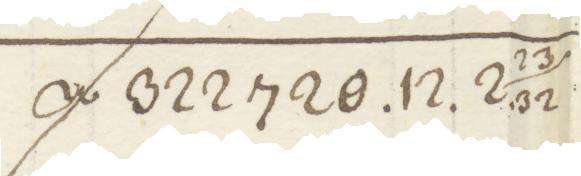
ƒ 322720.12.2 23/32
